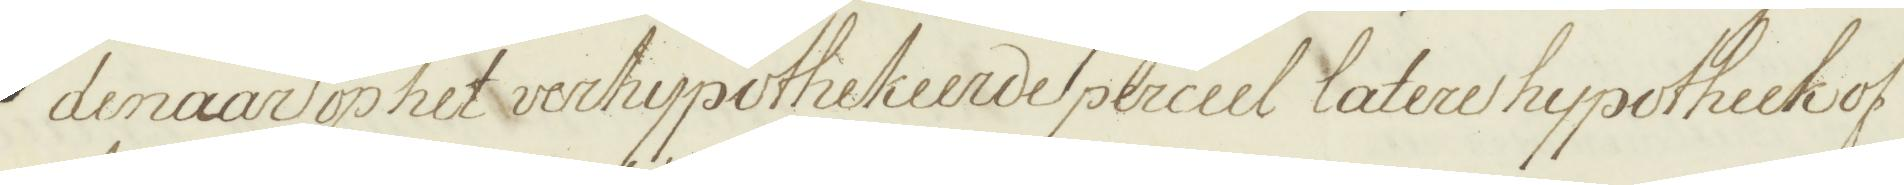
denaar op het verhypothekeerde perceel latere hypotheek of
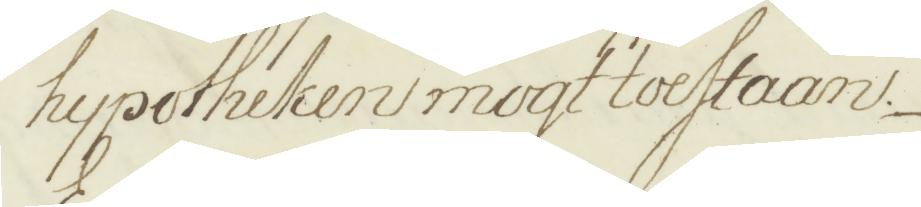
hypotheken mogt toestaan.
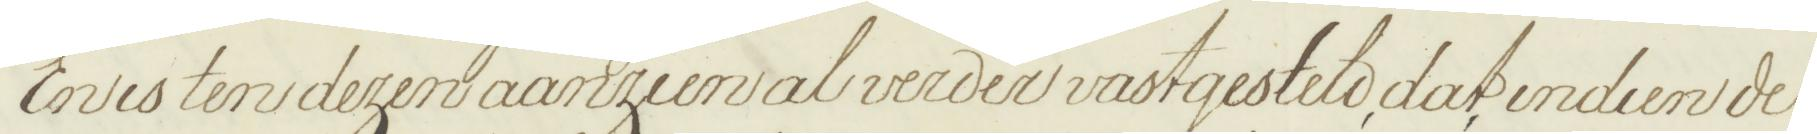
En is ten dezen aanzien al verder vastgesteld, dat, indien de
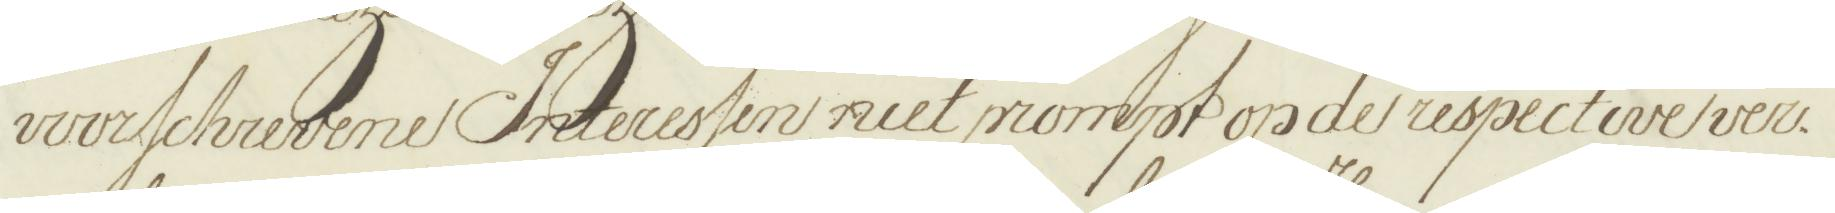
voorschrevene Interessen niet prompt op de respective ver„
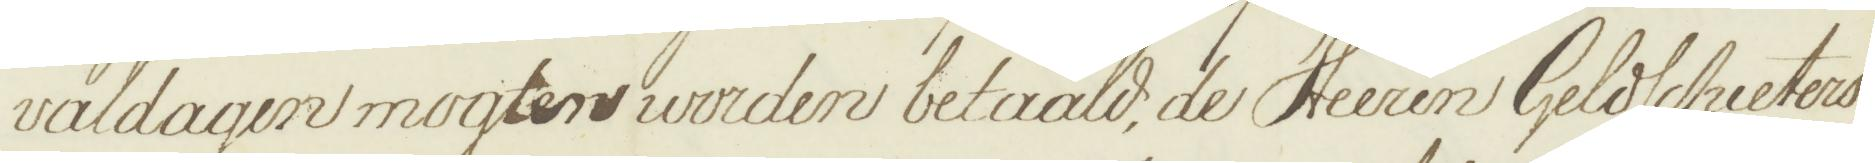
valdagen mogten worden betaald, de Heeren Geldschieters
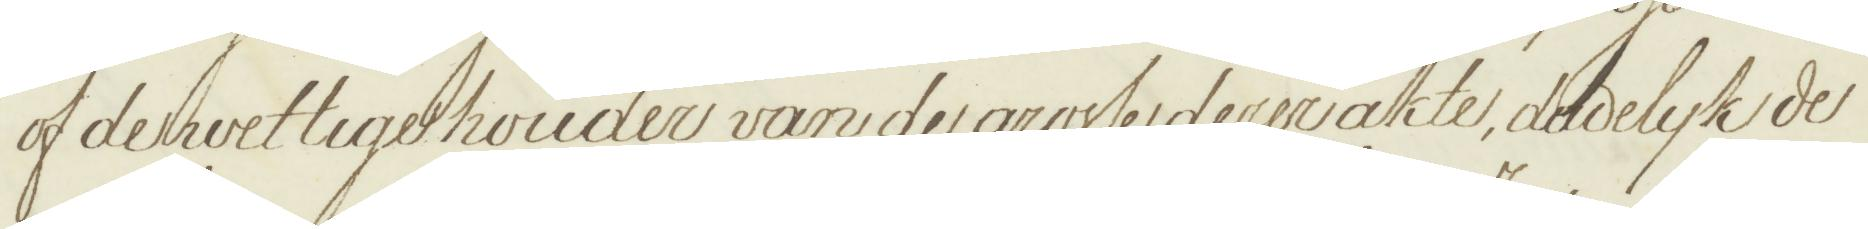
of de wettige houder van de grosse dezer akte, dadelyk de
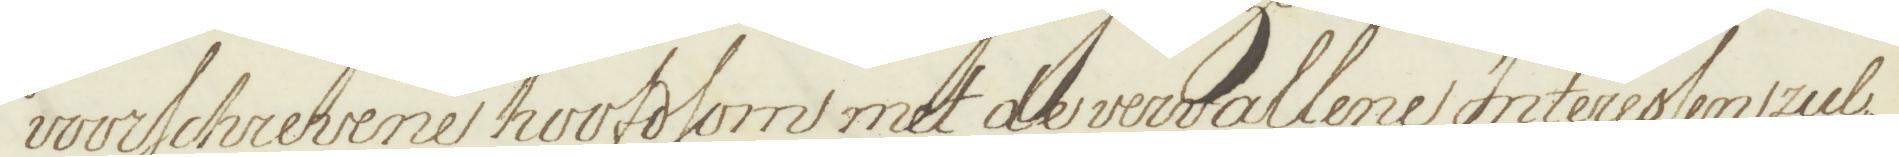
voorschrevene hoofdsom met de vervallene Interessen zul„
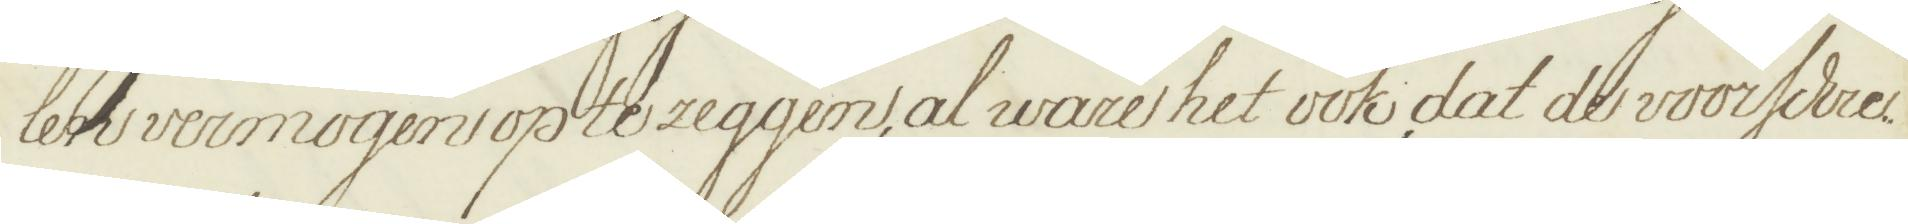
len vermogen op te zeggen, al ware het ook dat de voorschre„
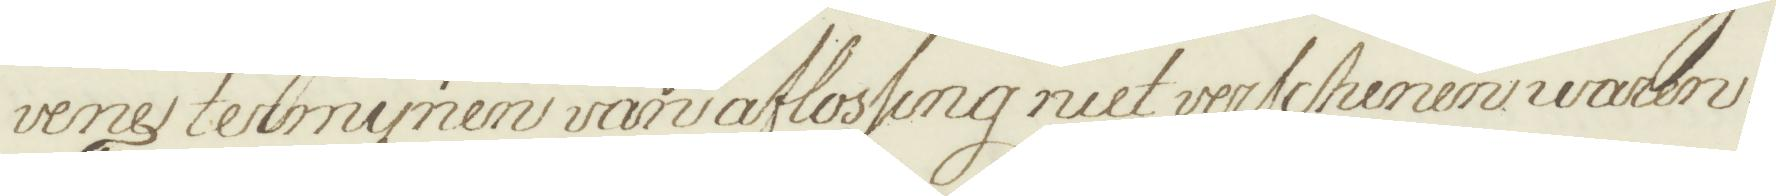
vene termynen van aflossing niet verschenen waren.
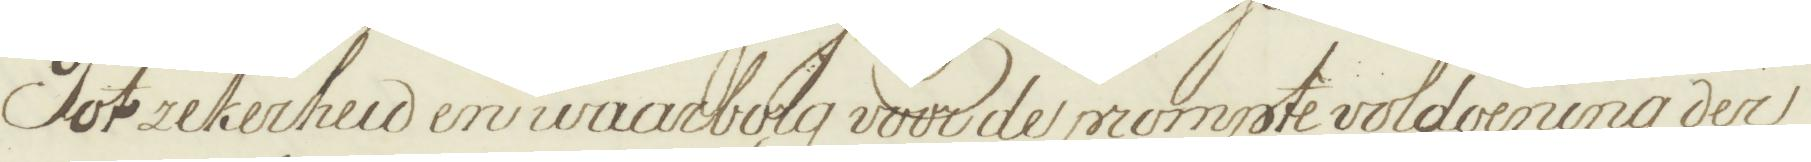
Tot zekerheid en waarborg voor de prompte voldoening der
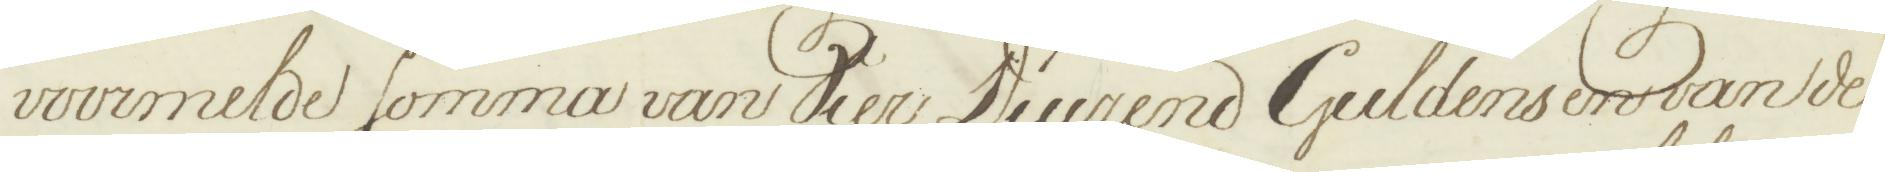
voormelde somma van Vier Duizend Guldens en van de
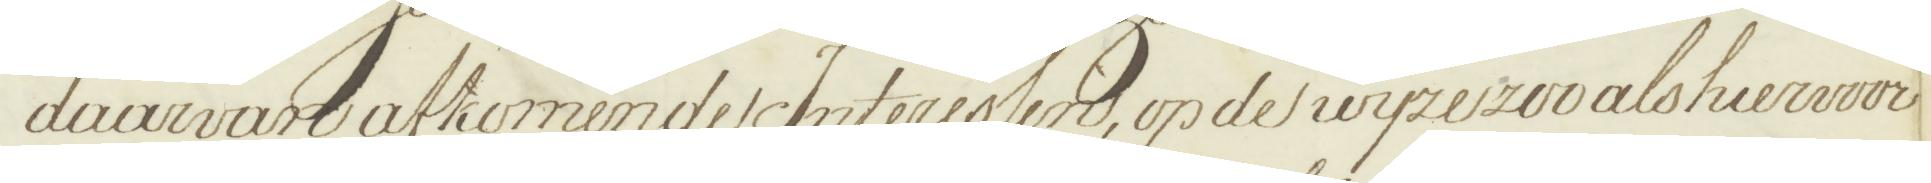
daarvan afkomende Interessen, op de wyze zoo als hiervoor
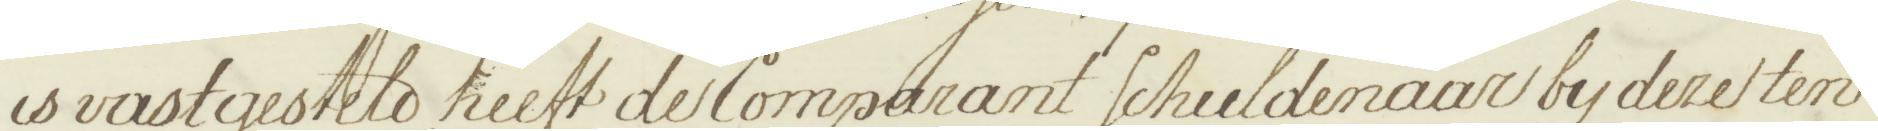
is vastgesteld, heeft de Comparant schuldenaar by deze ten
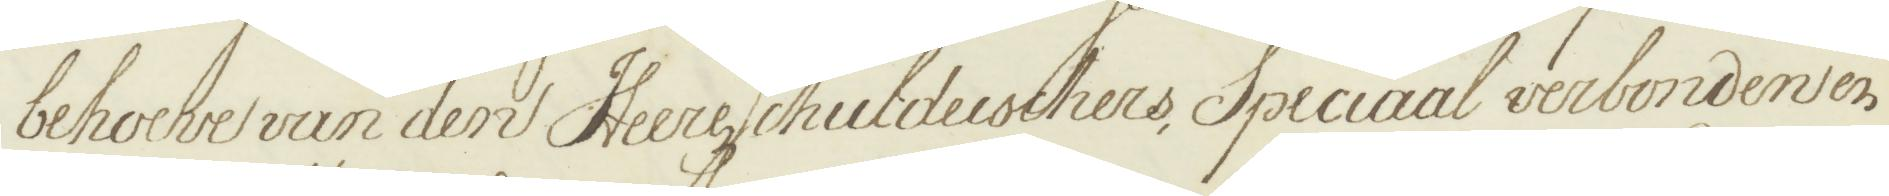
behoeve van den Heere schuldeischers, Speciaal verbonden en
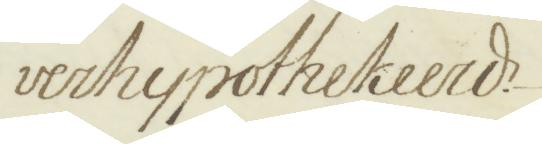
verhypothekeerd.
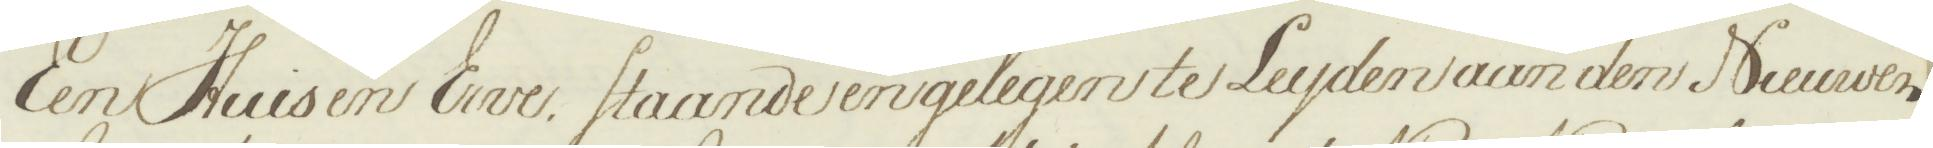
Een Huis en Erve, staande en gelegen te Leyden aan den Nieuwen
